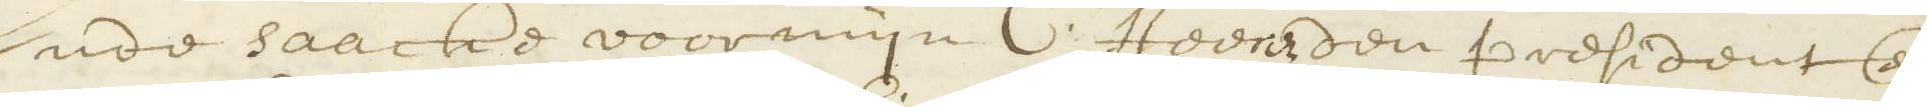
Jnde saacke voor mijn E: Heeren den president ende
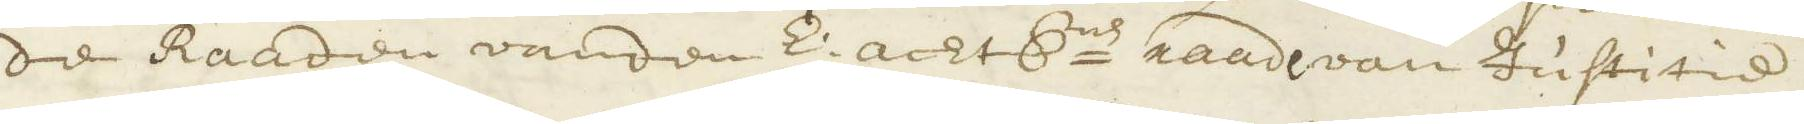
de Raaden vanden E: achtb=re raade van Justitie
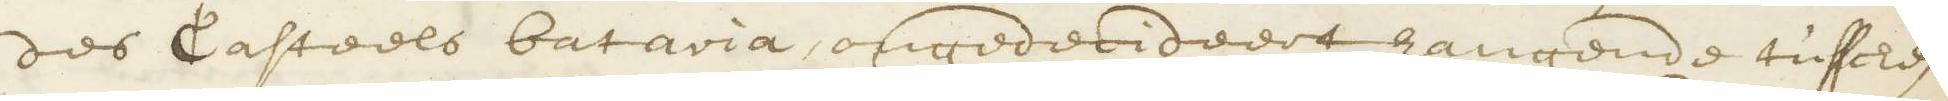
des Casteels batavia, ongedecideert hangende tusschen
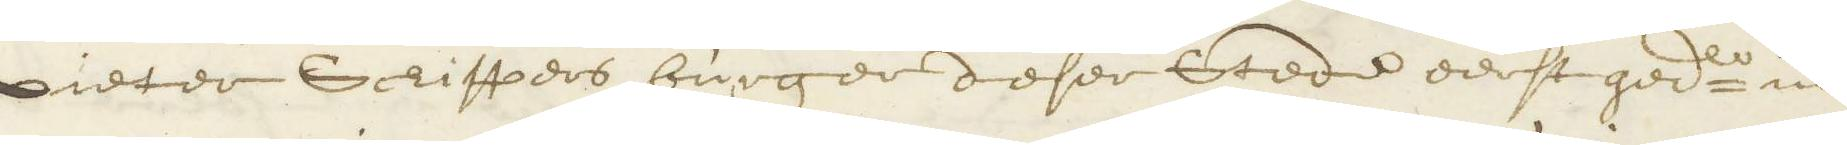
pieter schippers burger deser stede eerst ged=e in
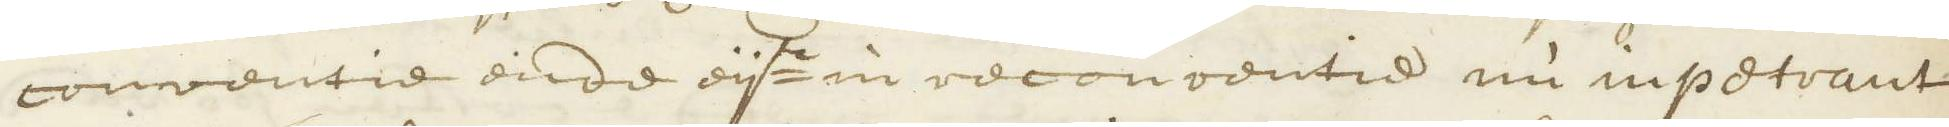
conventie ende eij=r in reconventie nu inpetrant
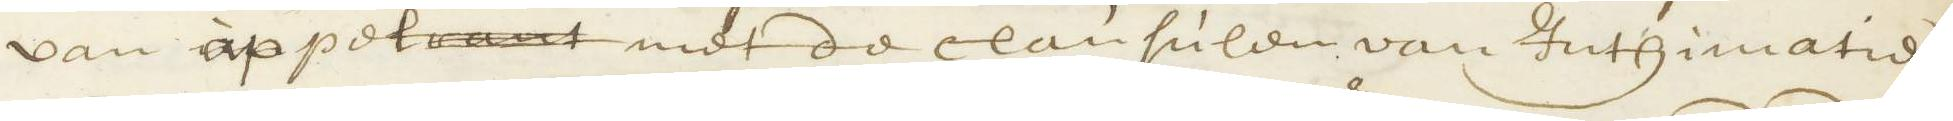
van àppelrant met de clausulen van Jnthimatie
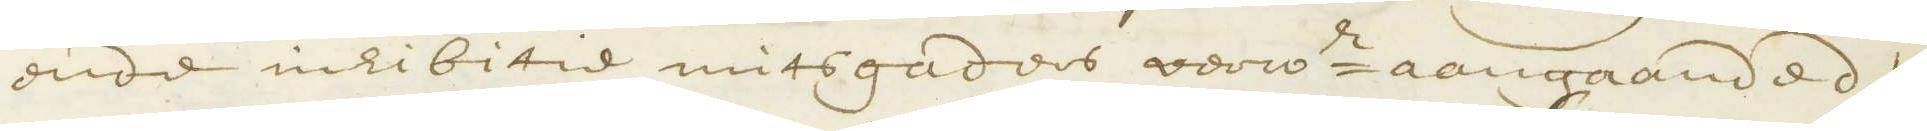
ende inhibitie mitsgaders verw=r aangaande de
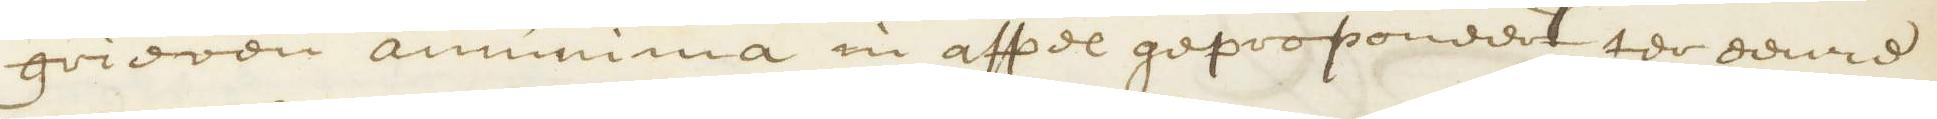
grieven amunima in appel geproponeert ter eenre
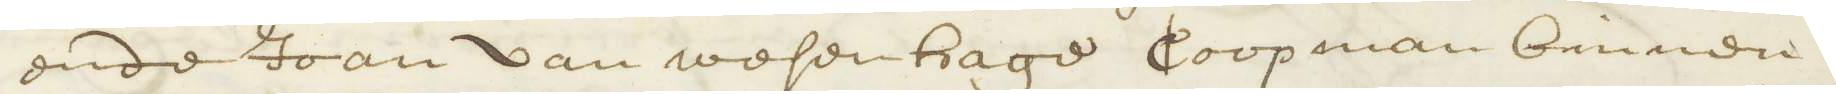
ende Joan van wesen hage Coopman binnen
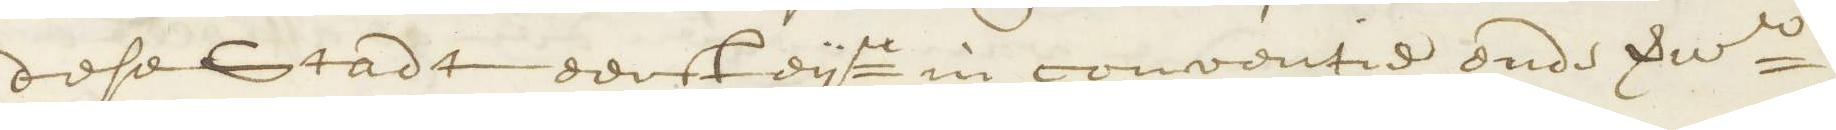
dese Stadt eerst eij=r in conventie ende verw=r
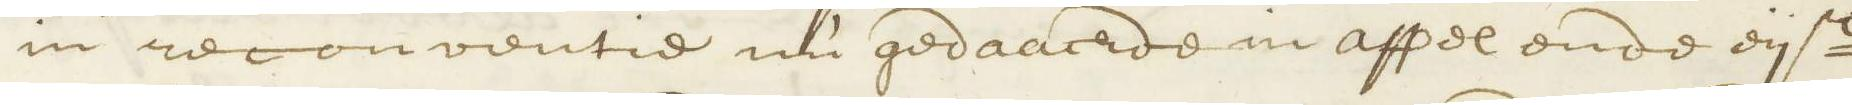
in reconventie nu gedaachde in appel ende eijs=r
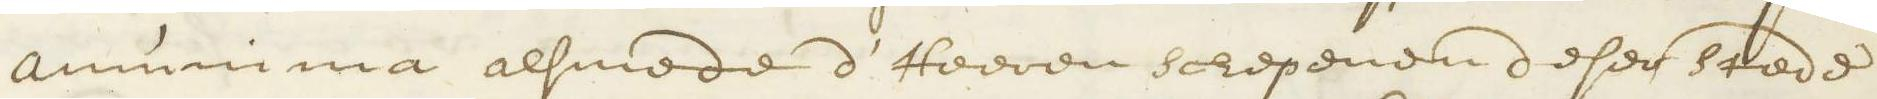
amunima alsmede d’ Heeren schepenen deser stede
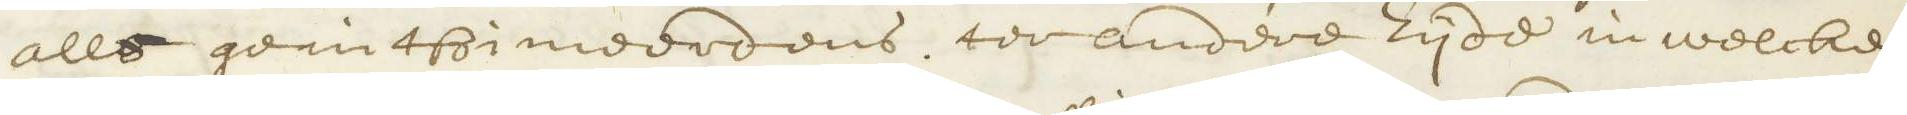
alle geinthimeerdens, ter andere zijde in welcke
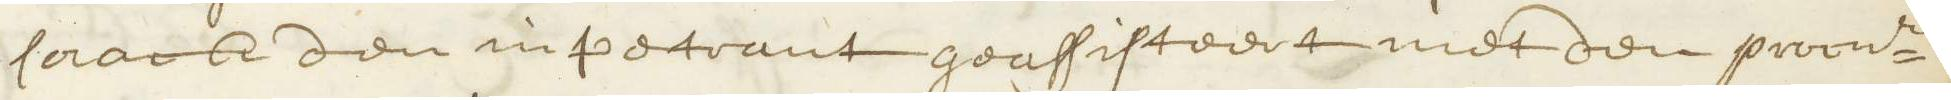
saack den inpetrant geassisteert met den procu=r
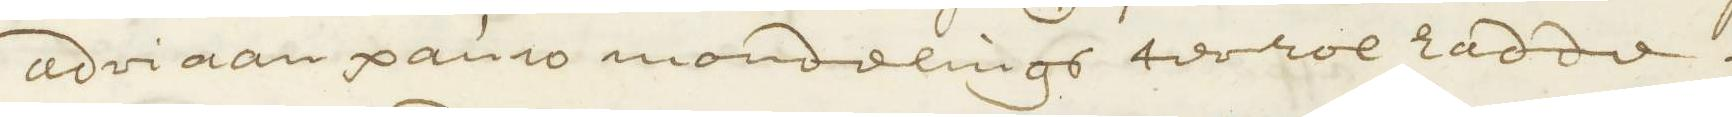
adriaan pauw mondelings ter rol hadde
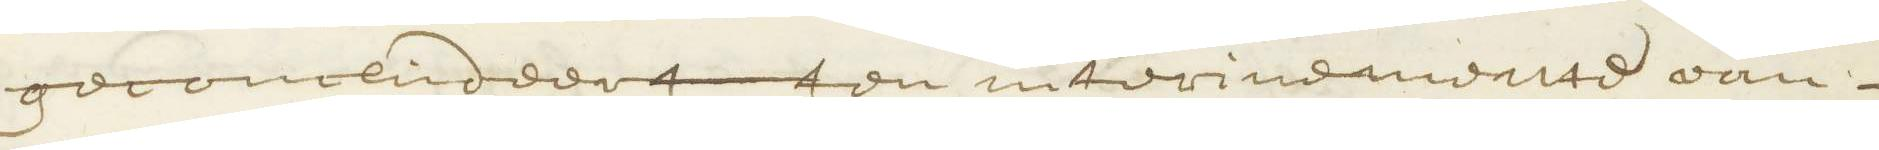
geconcludeert ten interinemente van
